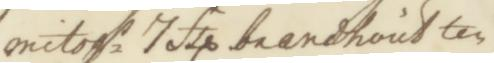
mitsg=s 7 stx brandhout ten
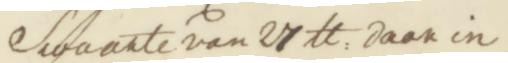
swaarte van 27 lb: daar in
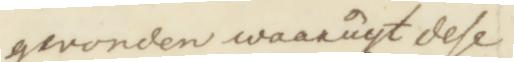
gevonden waar uijt dese
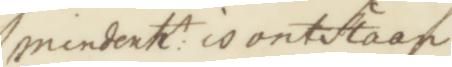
minderh:t is ontstaan
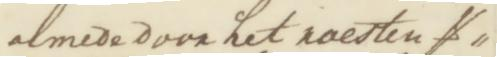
almede door het roesten ver„
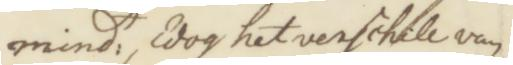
mind:t, Edog het verschile van
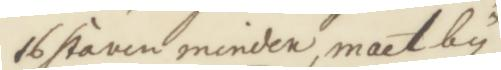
16 staven minder, moet bij
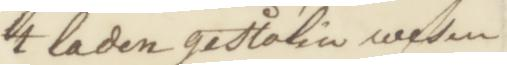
’t laden gestolen wesen
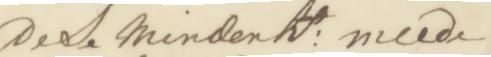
dese minderh:t meede
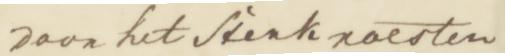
door het sterk roesten
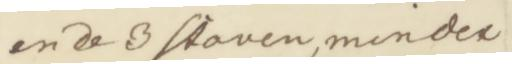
en de 3 staven, minder
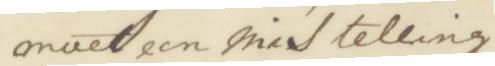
moet een mis telling
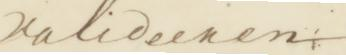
valideeren:
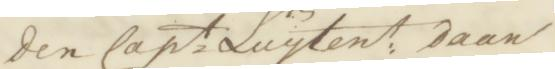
den Cap=t Luijten:t daar
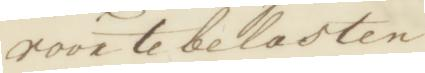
voor te belasten
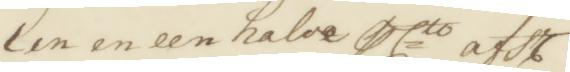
Een en een halve pC=to afsz
